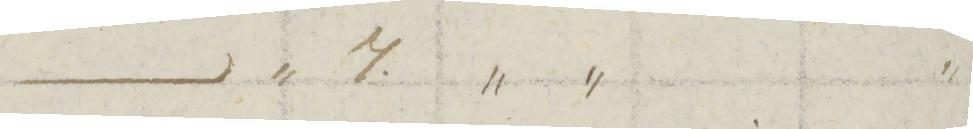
— „ 7. „ „ „
